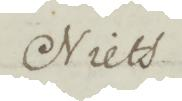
Niets
